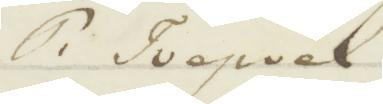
P: Toepoel
